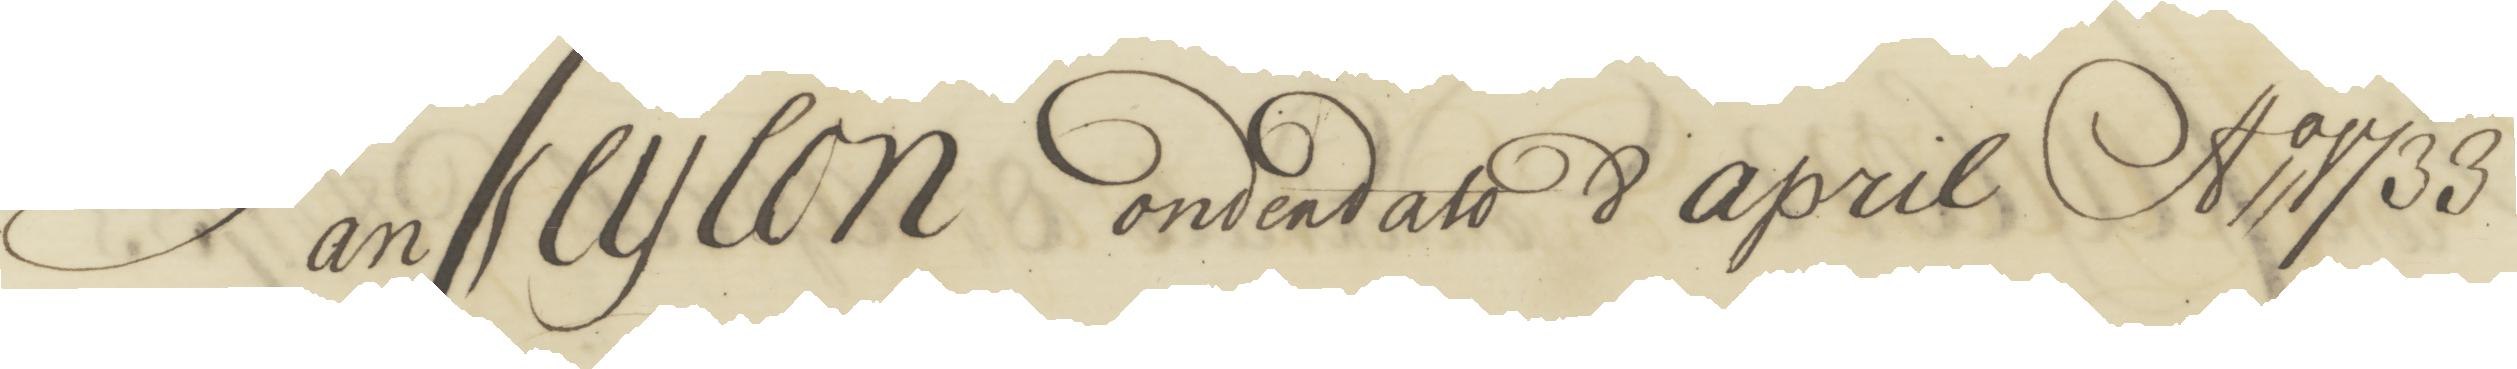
Van Ceijlon onder dato 8e april A„o 1733
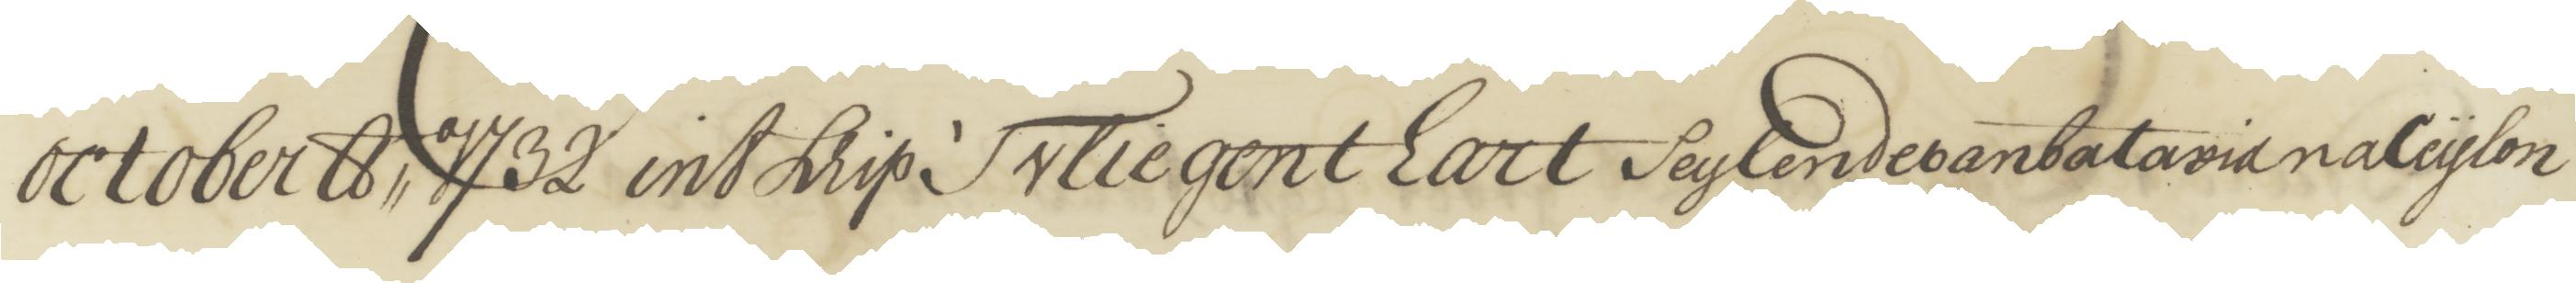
october A„o 1732 in't schip 'T vliegent hart Seylende van batavia na Ceijlon
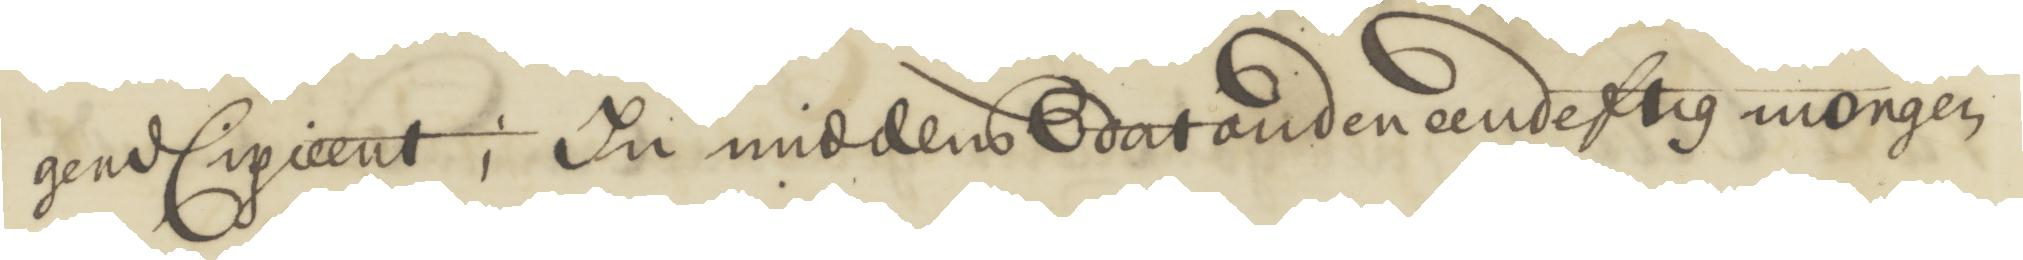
gerecipieert, In middens dat onder een deftig morgen
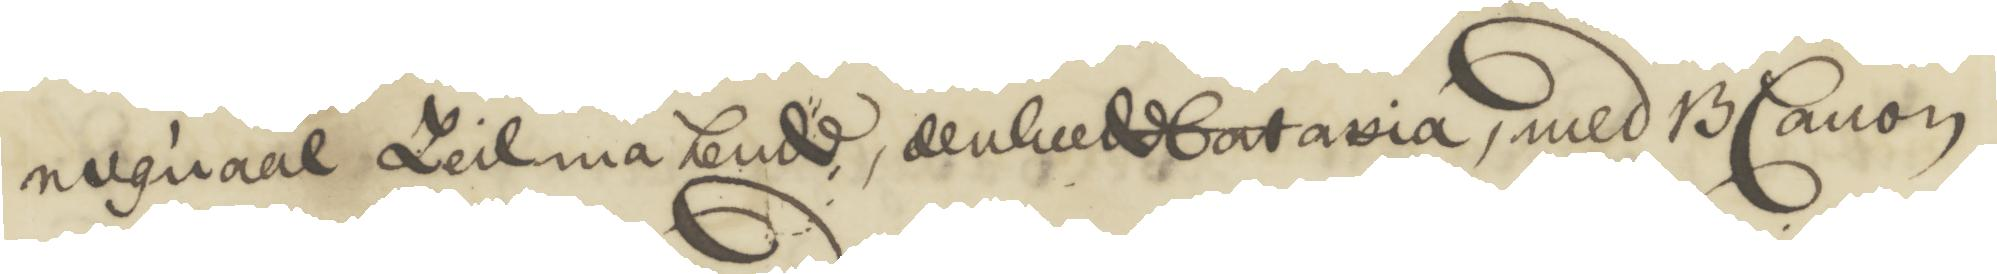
reguaal Zeilmakende, de rheede batavia, med 13 Canon
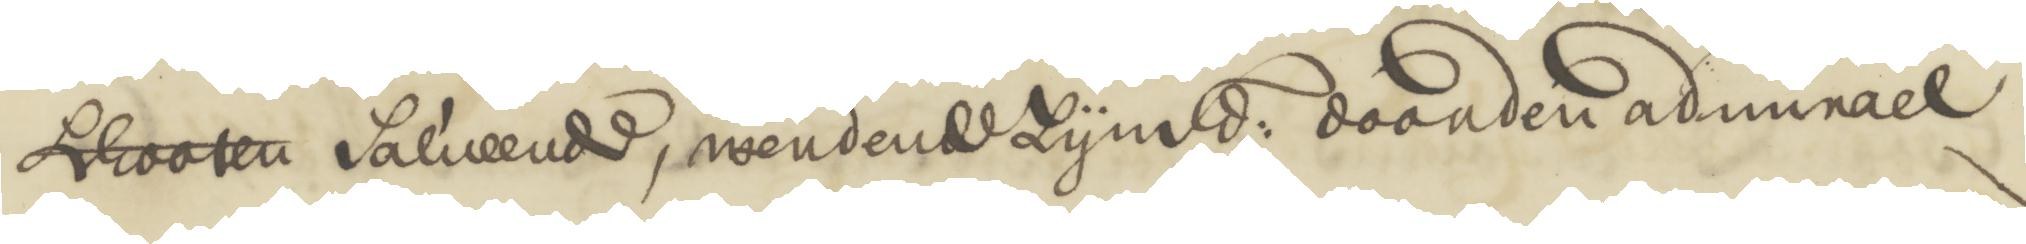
schooten Salueerde, werdende Zijn Ed: door den admirael
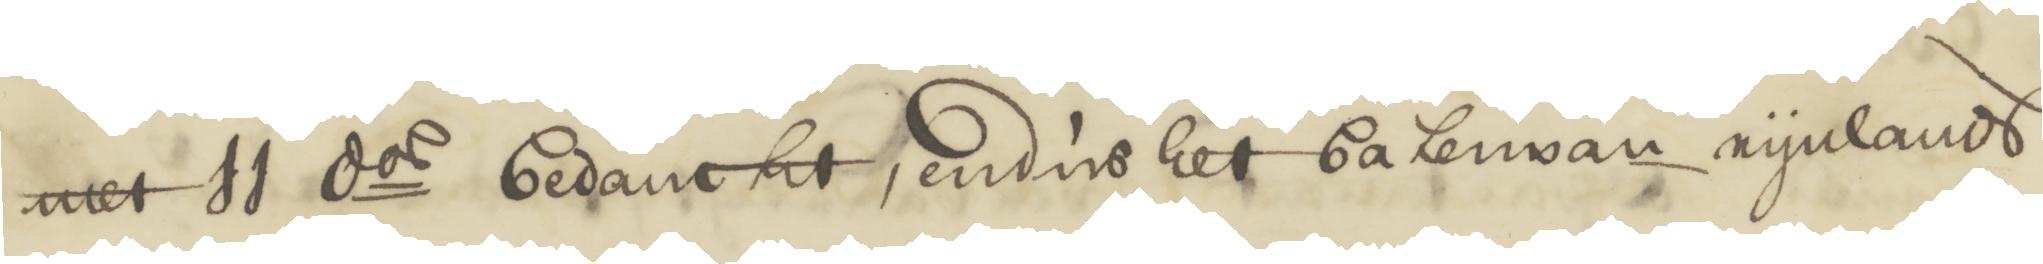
met 11 d=os bedanckt, en dus het baken van rijnlands
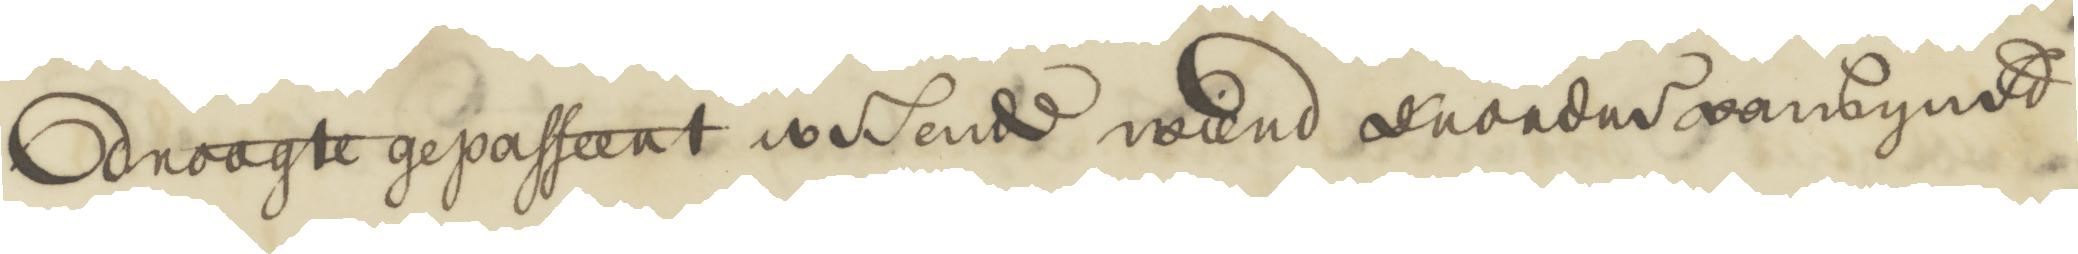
droogte gepasseert wesende wierd ter ordre van Syn Ed
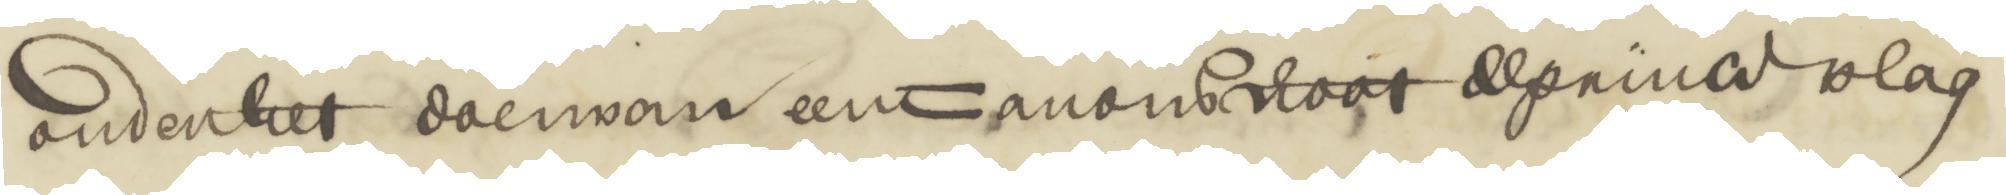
onder het doen van een Canonschoot de prince vlag
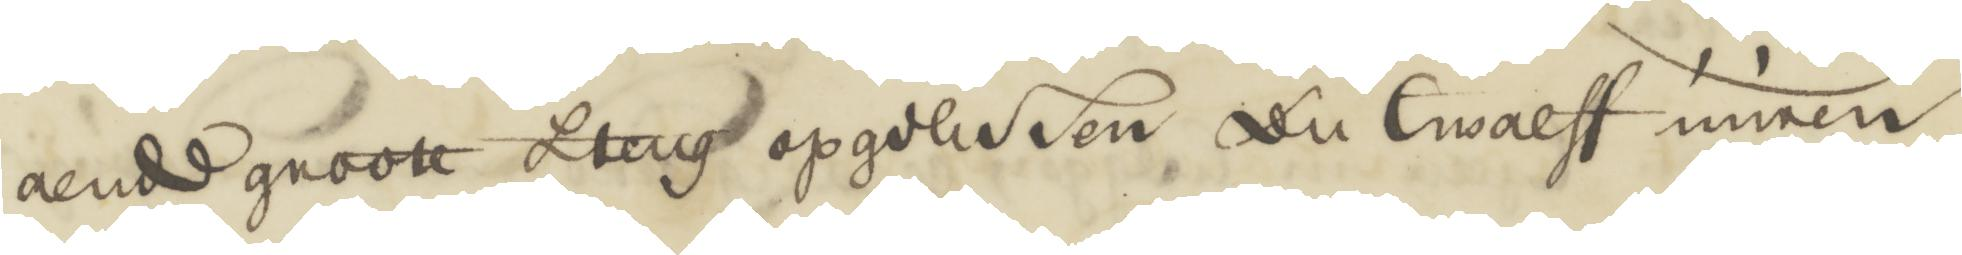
aende groote steng opgehesen ten twalff uuren
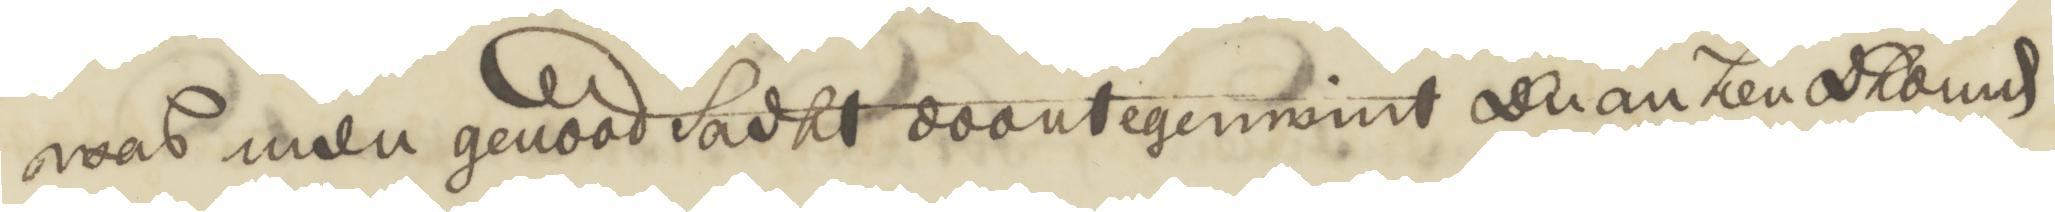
was men genoodsaekt door tegenwint tenanker tekomen
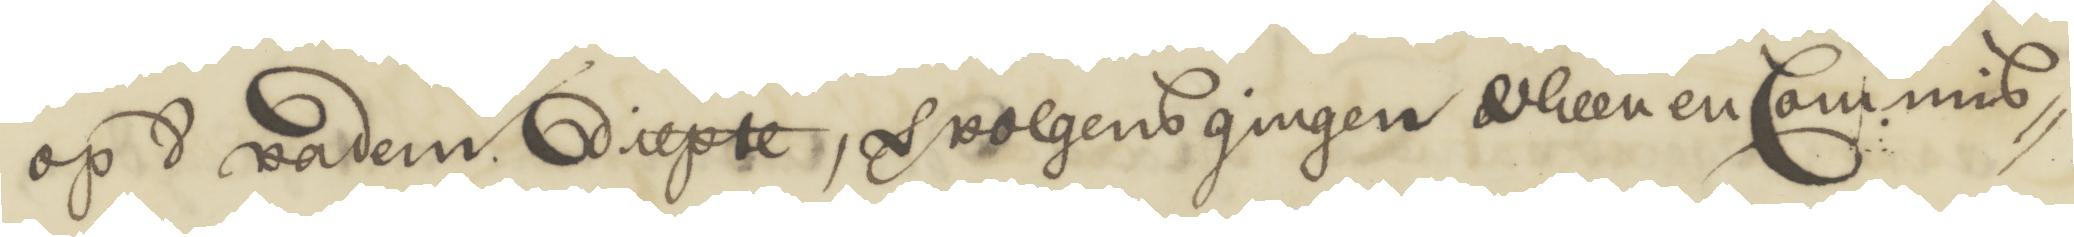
op 8 vadem diepte, vervolgens gingen de heeren Commis„
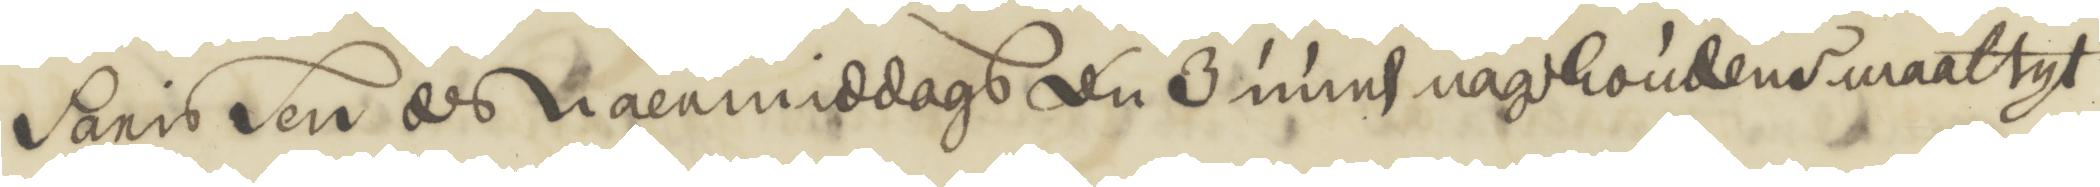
Sarissen des naermiddags ten 3 uuren nagehoudene maaltyt
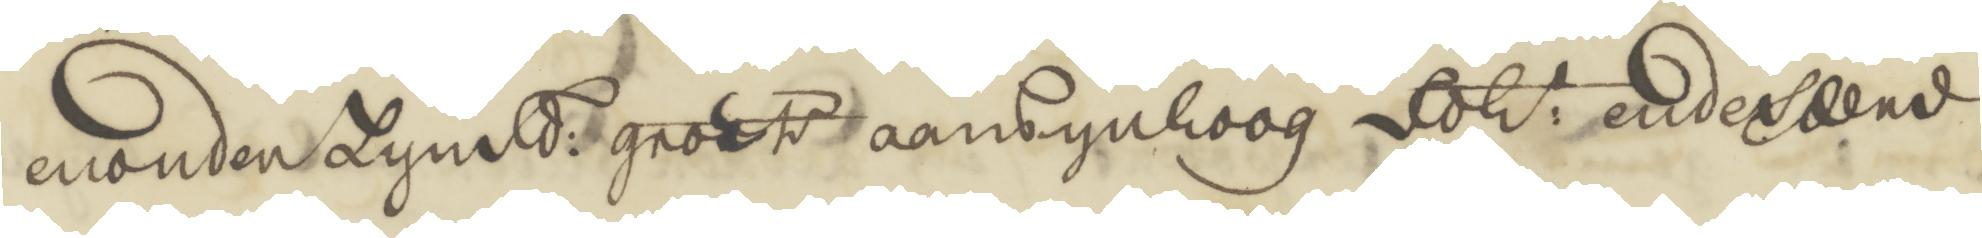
en onder Zyn Ed: groete aan syn hoog Edh:t en de verdere
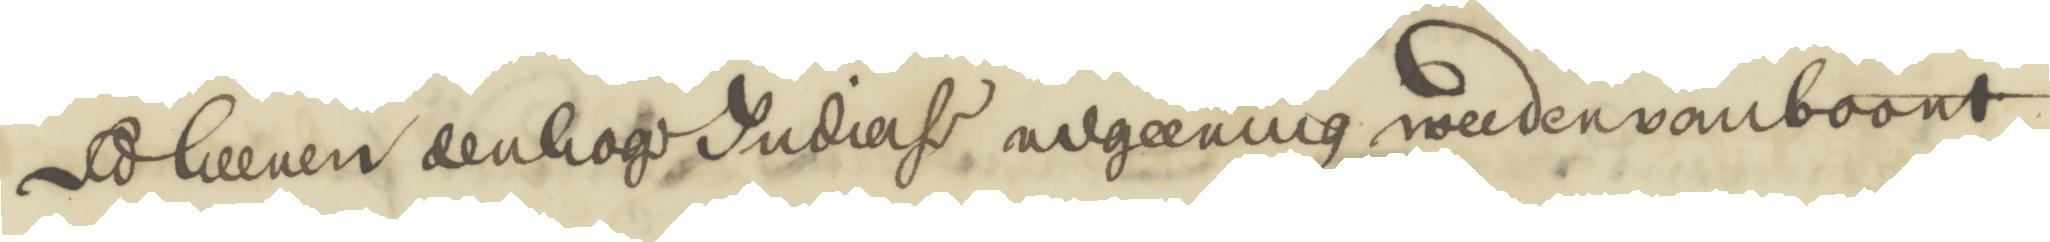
Ed heeren den hoge Indiase regeering weeder van boort
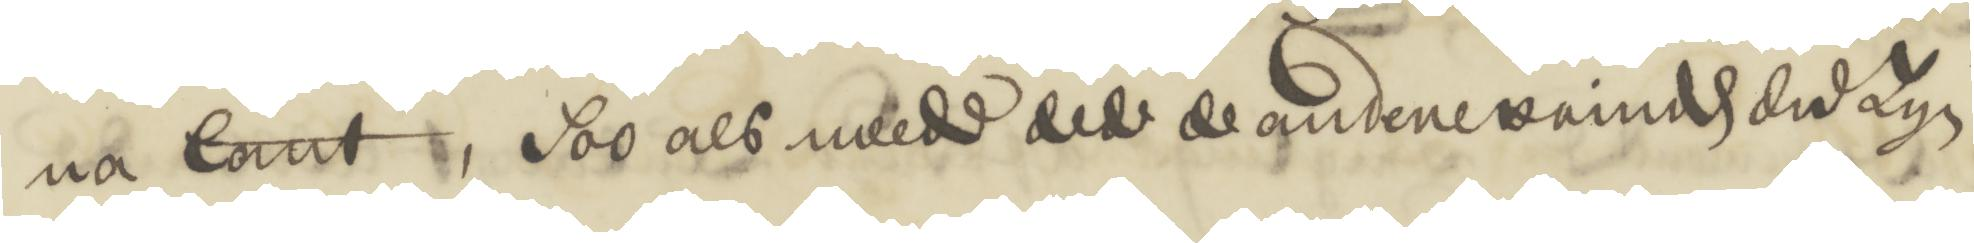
na lant, Soo als meede dede de andere vrinden die Zyn
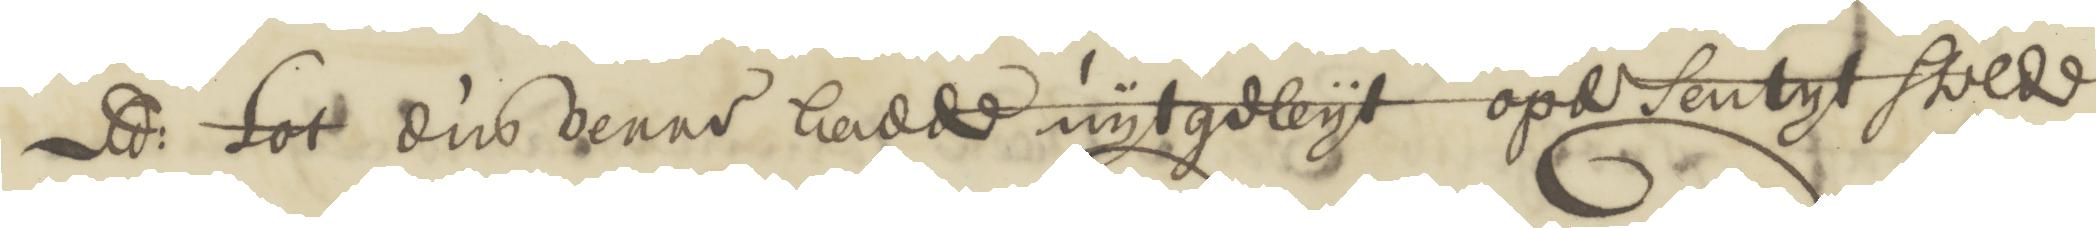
Ed: tot dusverre hadde uijtgeleijt op desen tyt stelde
